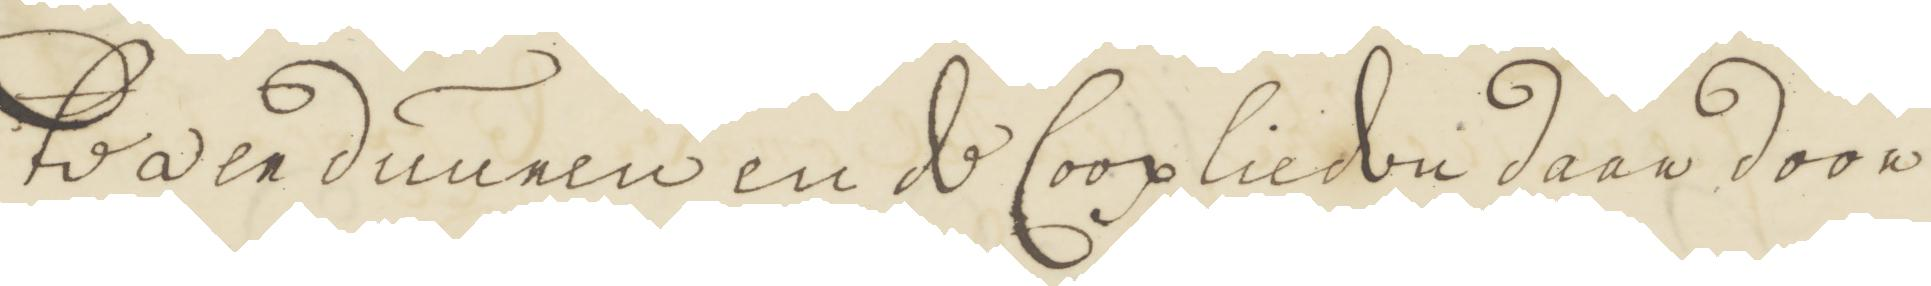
te verduuren en de Cooplieden daar door
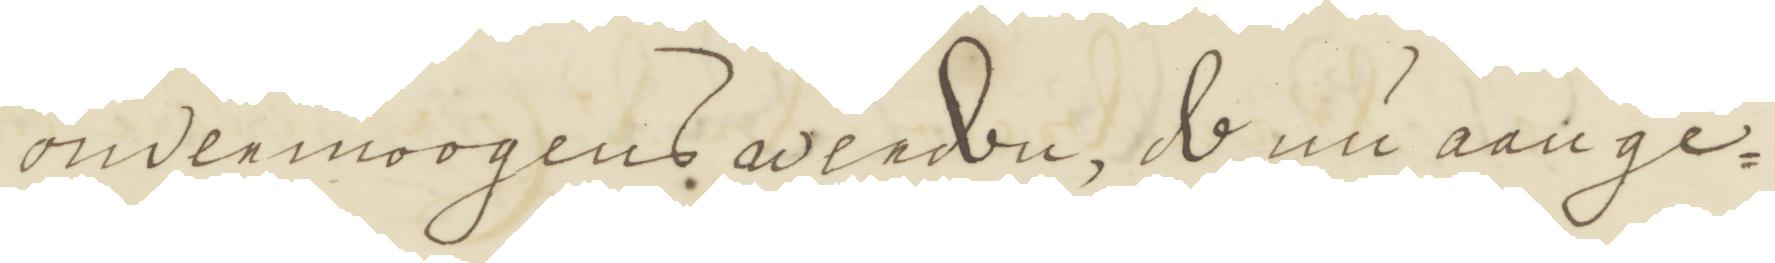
onvermoogens werden, de nu aange=
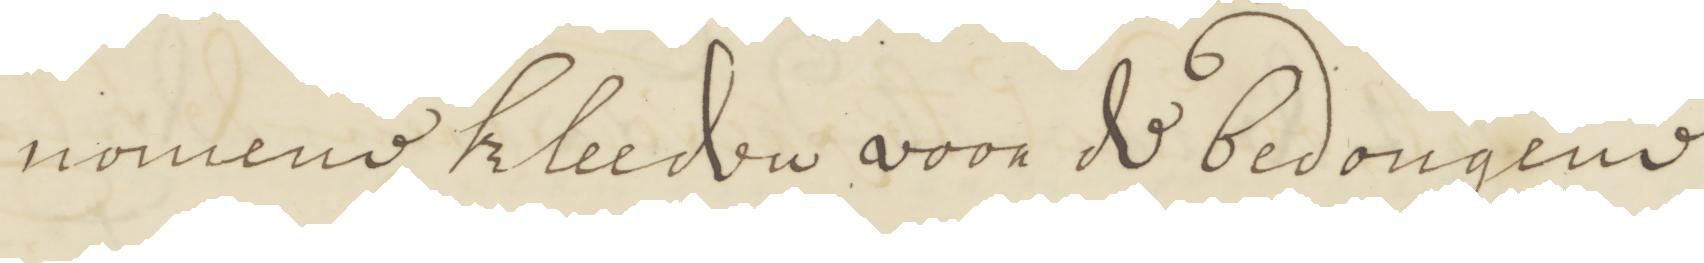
nomene kleeden voor de bedongene
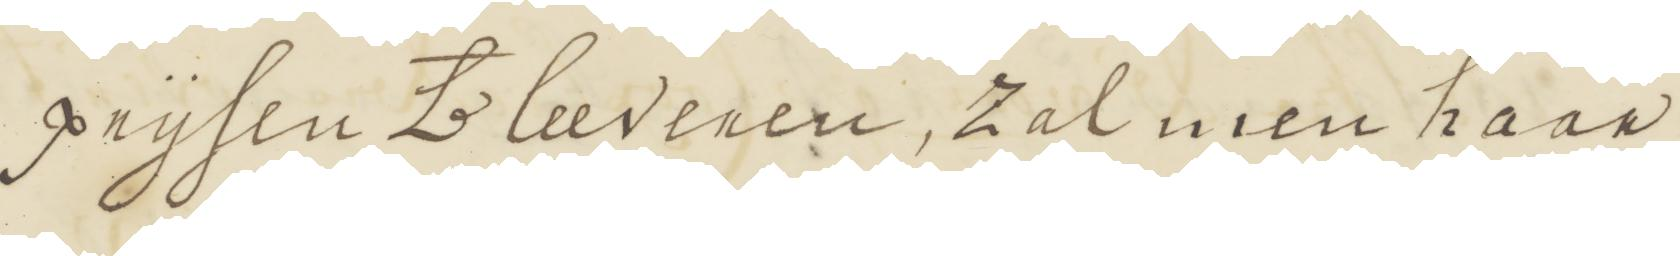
prijsen te leeveren, zal men haar
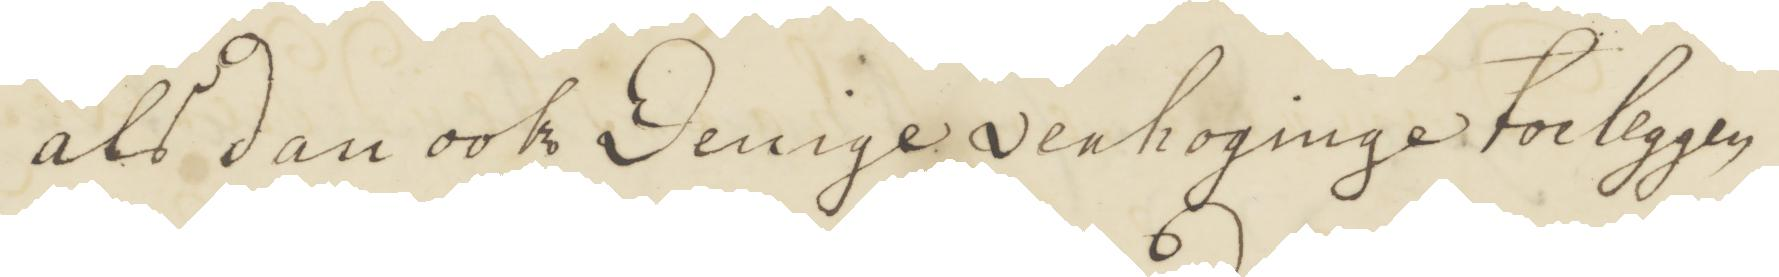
als dan ook Eenige verhoginge toeleggen
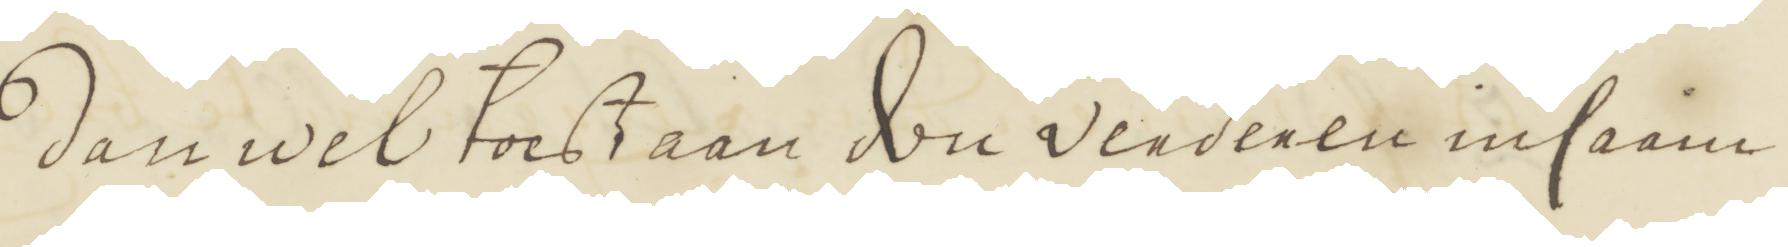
dan wel toestaan den verderen insaam
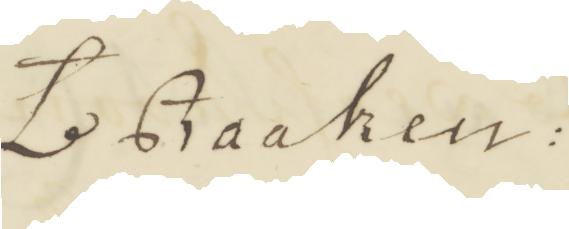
te staaken:
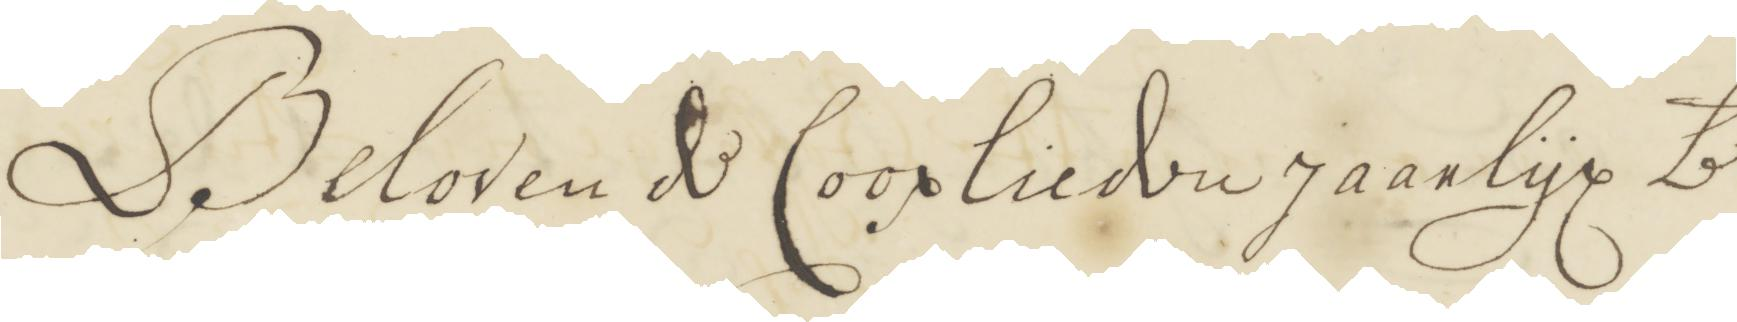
Beloven de Cooplieden jaarlijx te
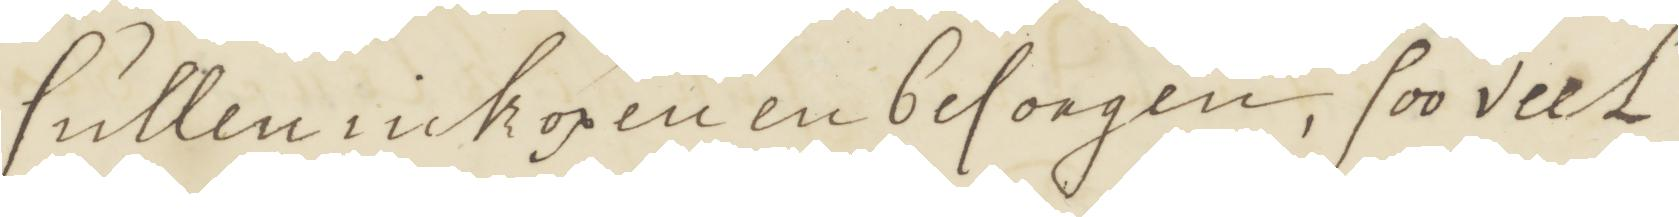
sullen inkopen en besorgen, soo veel
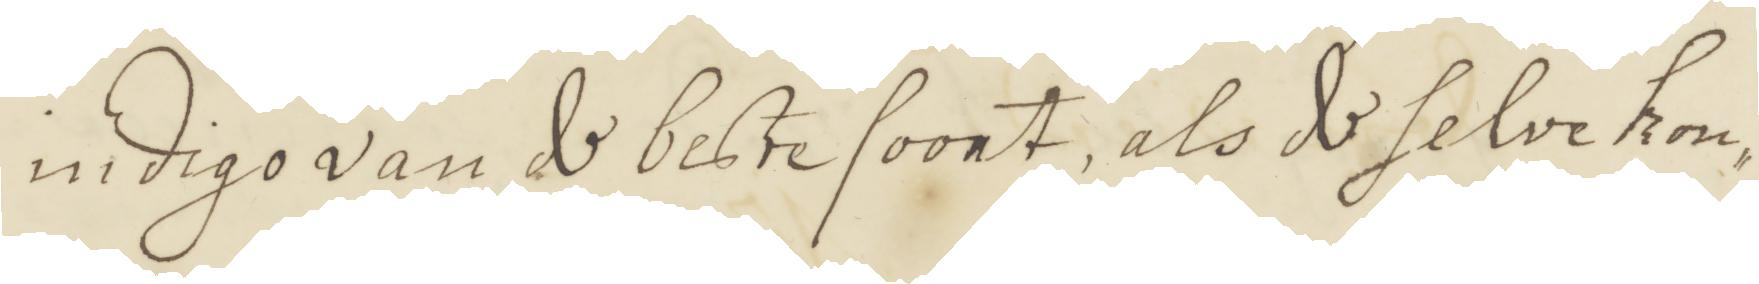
indigo van de beste soort, als de selve kon
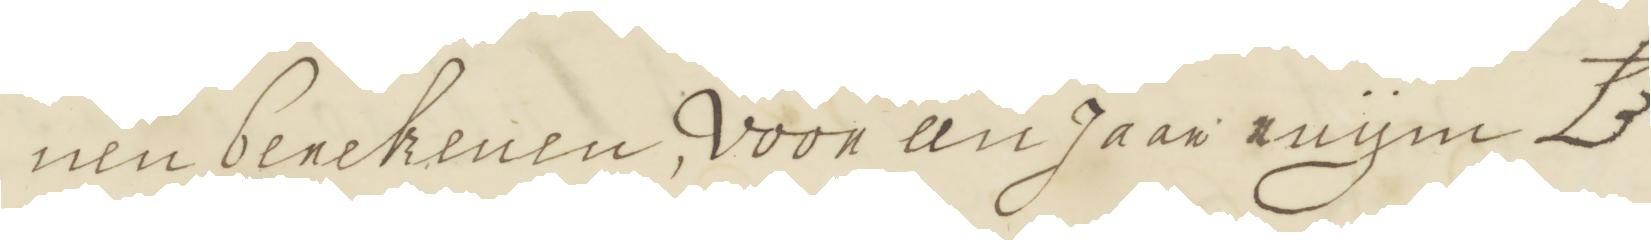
nen berekenen, voor een Jaar ruijm te
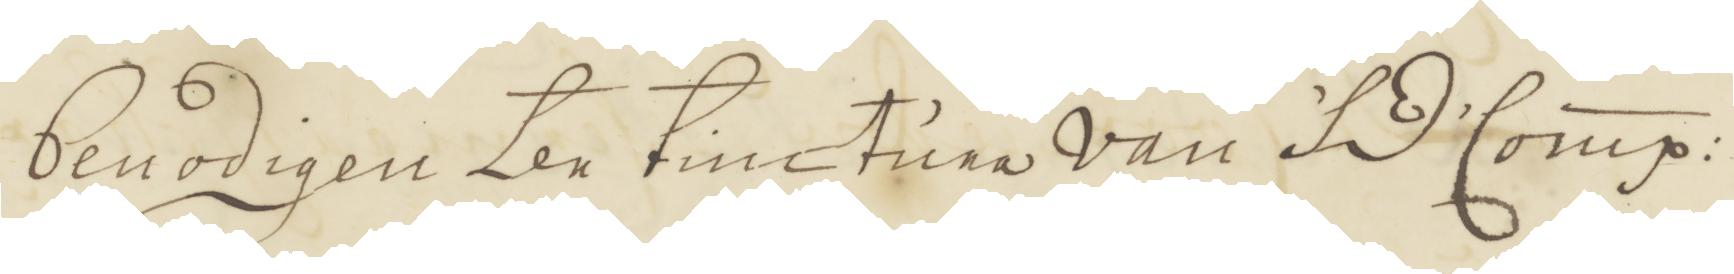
benodigen ter tinctura van ’sE'Comp:
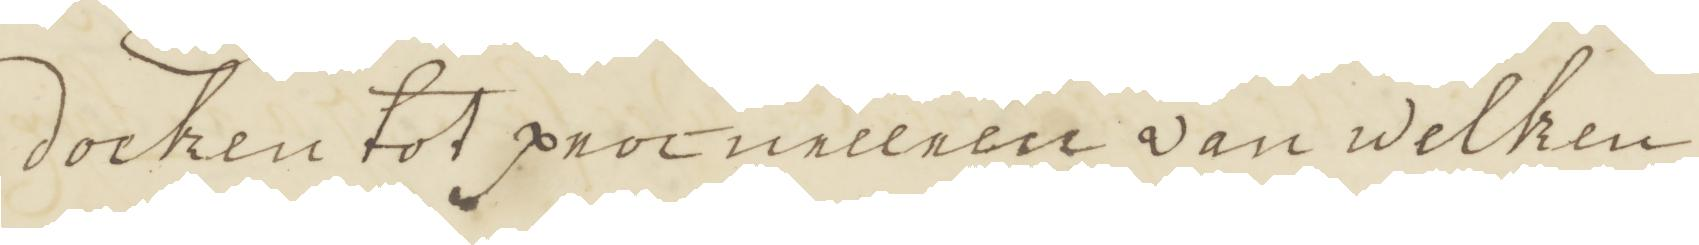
doeken tot procureeren van welken
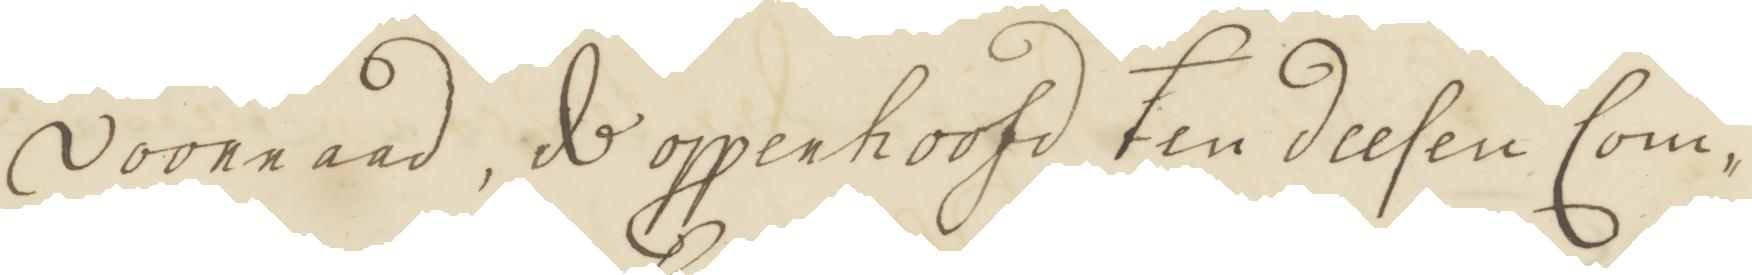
voorraad, de opperhoofd ten deesen Com„
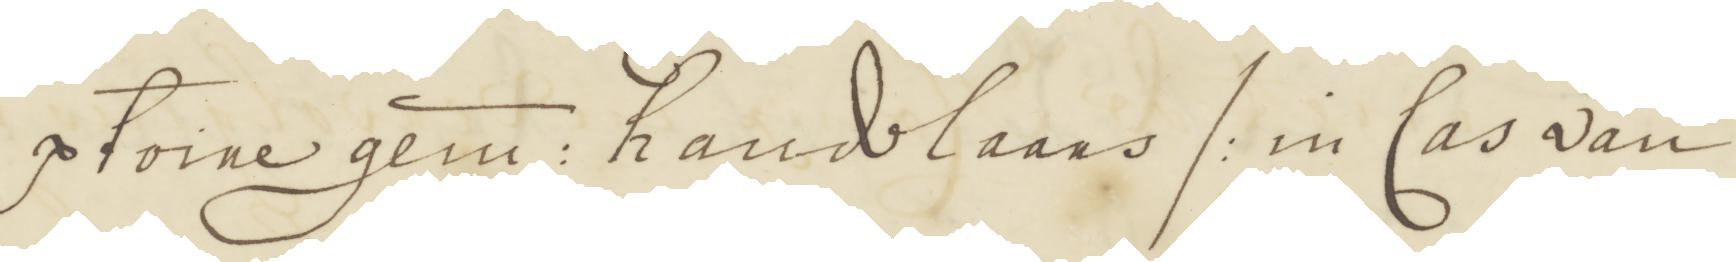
ptoire gem: handelaars /:in Cas van
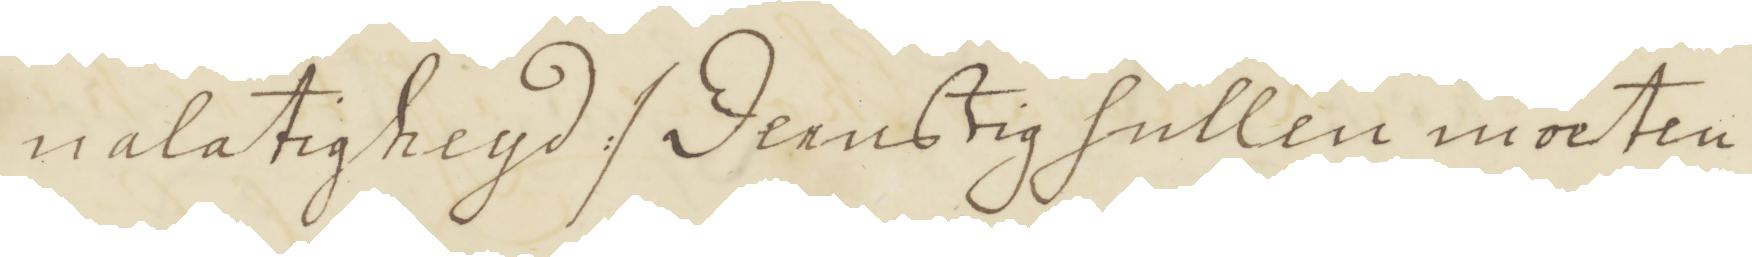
nalatigheyd:/ Eernstig sullen moeten
